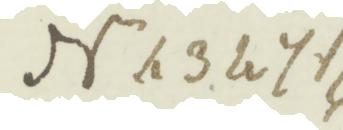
No 43.47R
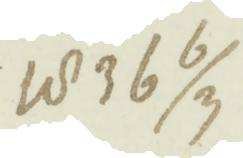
1836 6/3
